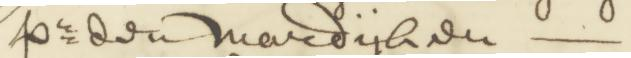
p=r den mardijker —
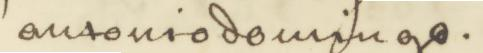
antonio domingo.
